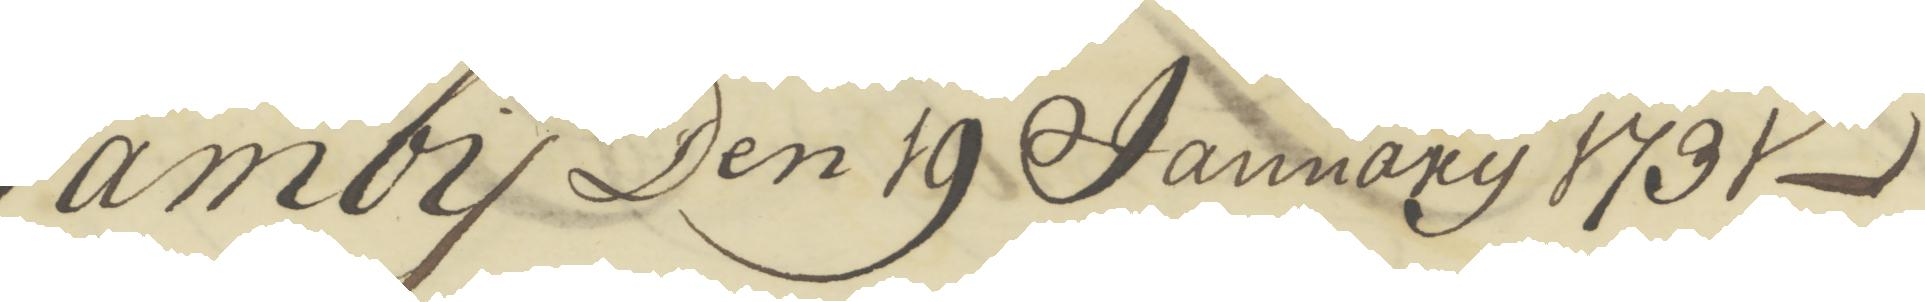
Van Jambij den 19 Januarij 1731 —
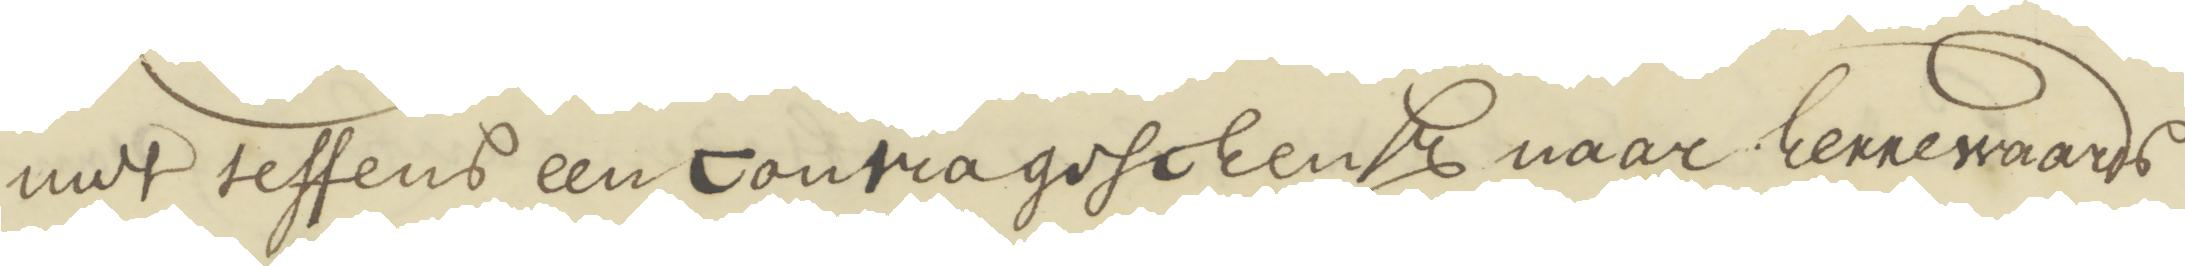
met teffens een contrageschenk naar herrewaards
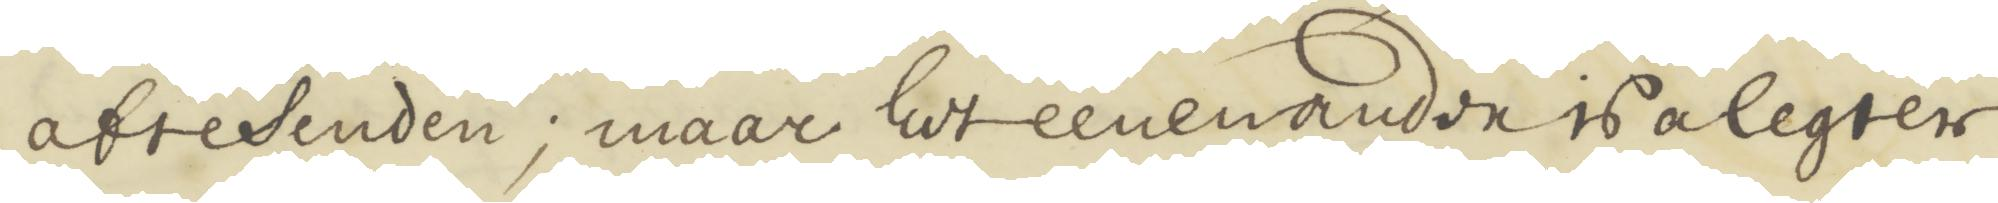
aftesenden; maar het eenen ander is alegter
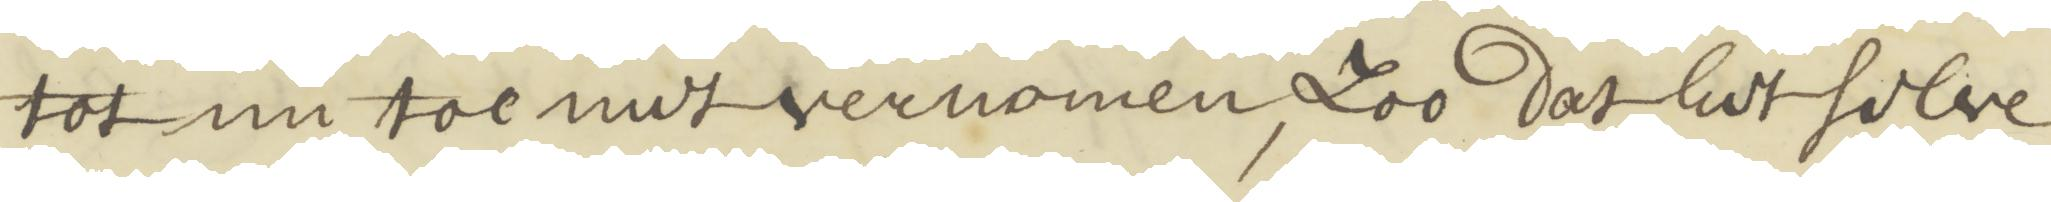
tot nu toe niet vernomen, zoo dat hetselve
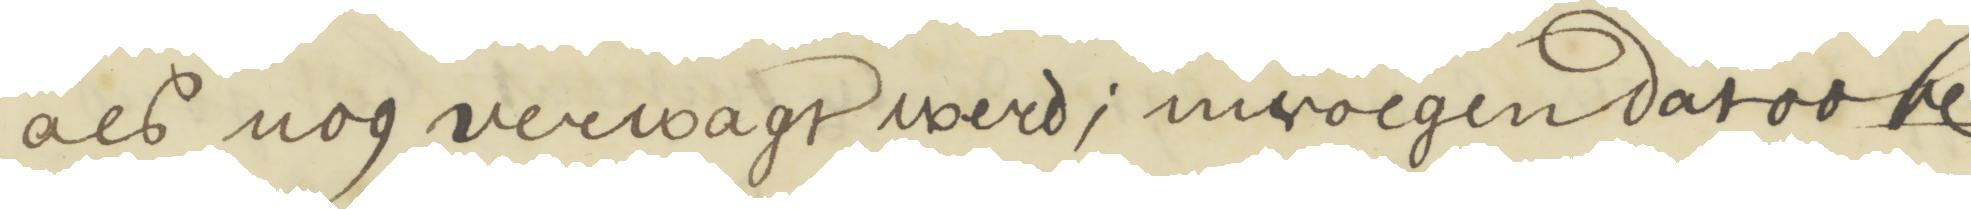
als nog verwagt werd; invoegen dat ook
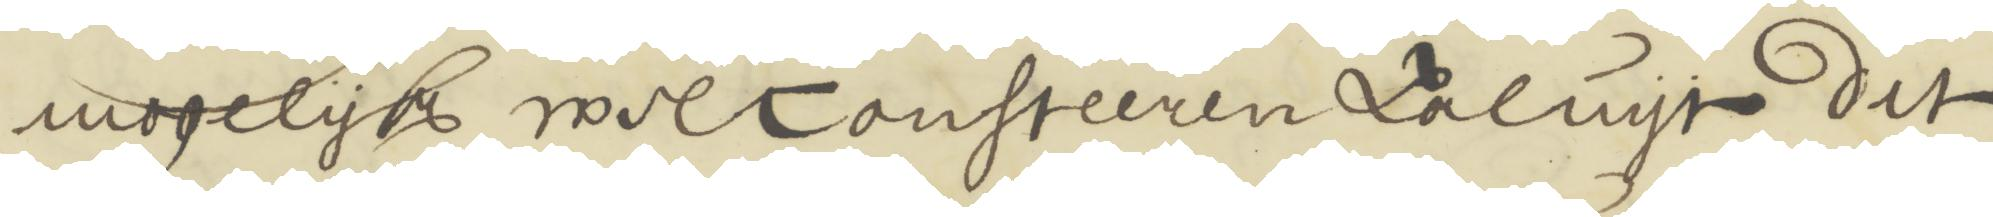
mogelijk wel consteeren zal uijt dit
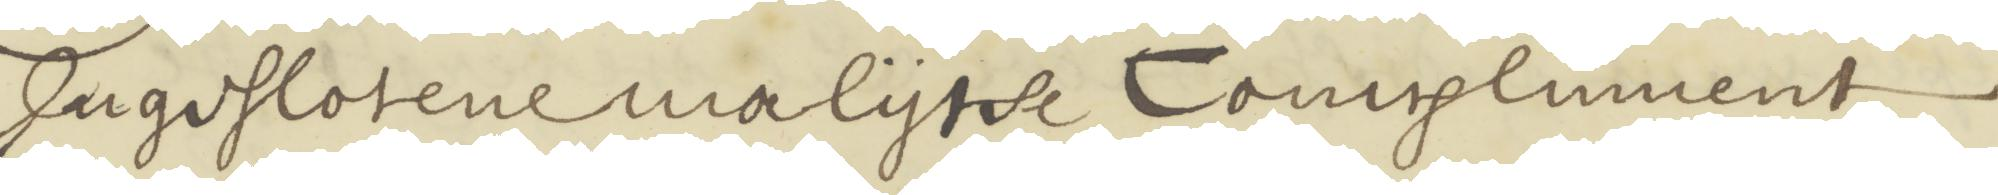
Ingeslotene malijtse Complument
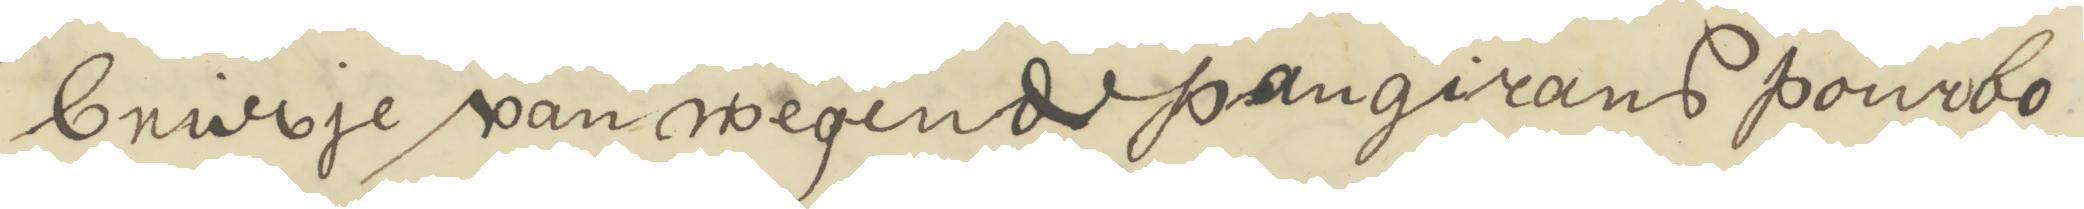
brievje van wegen de pangirans pourbo
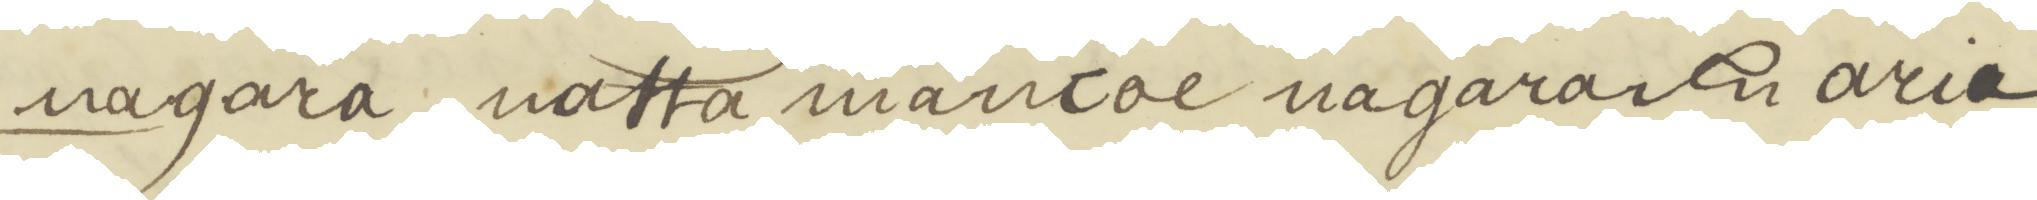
nagara, natta mancoe nagara, En aria
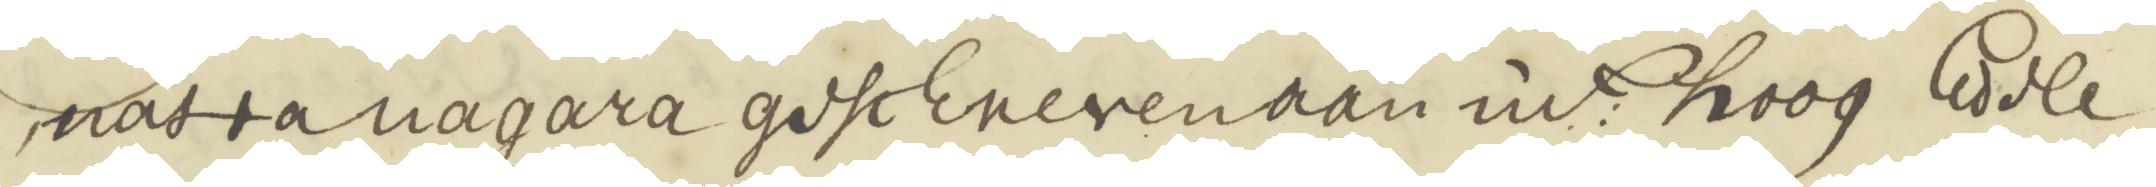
,natta nagara geschreven aan uE: hoog Edele
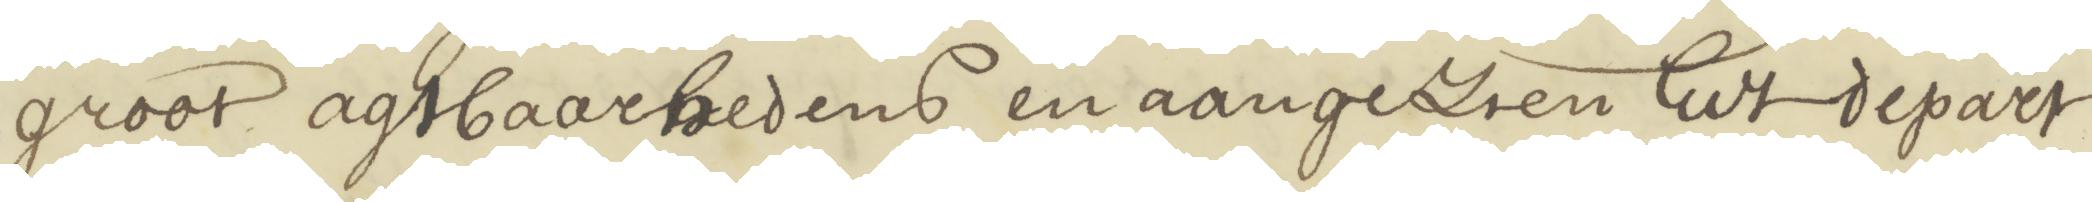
groot agtbaarhedens en aangezien het depart
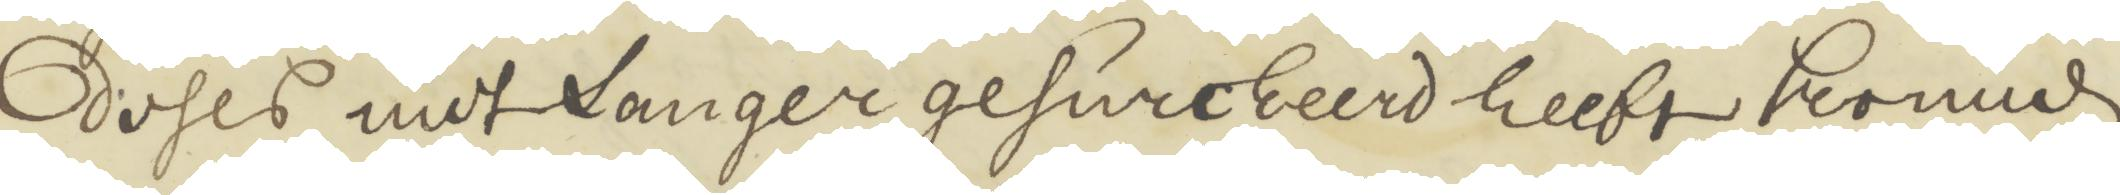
deses met langer gesurcheerd heeft konnen
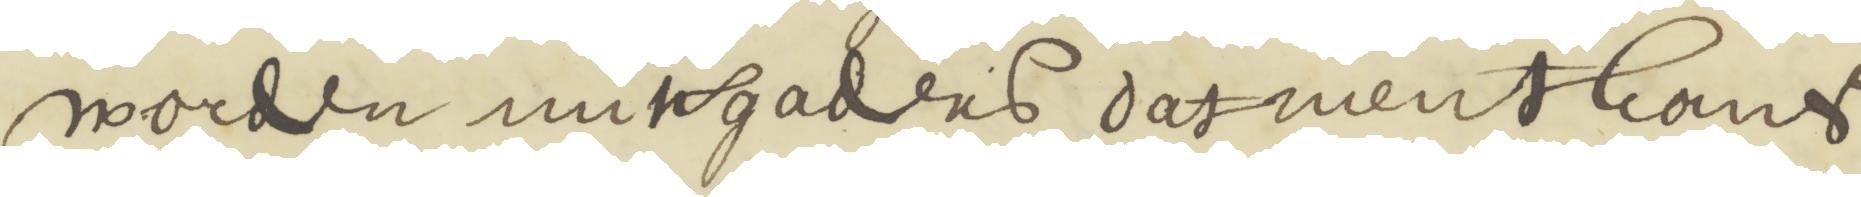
worden mitsgaders dat men thans
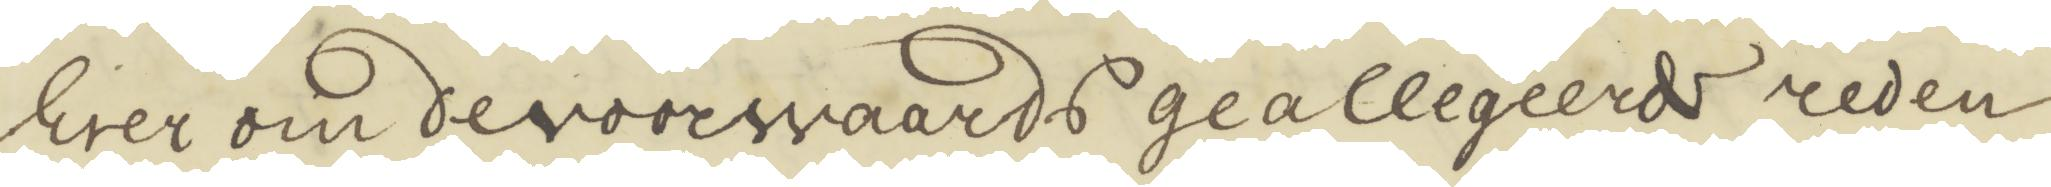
hier om de voorwaards geallegeerde reden
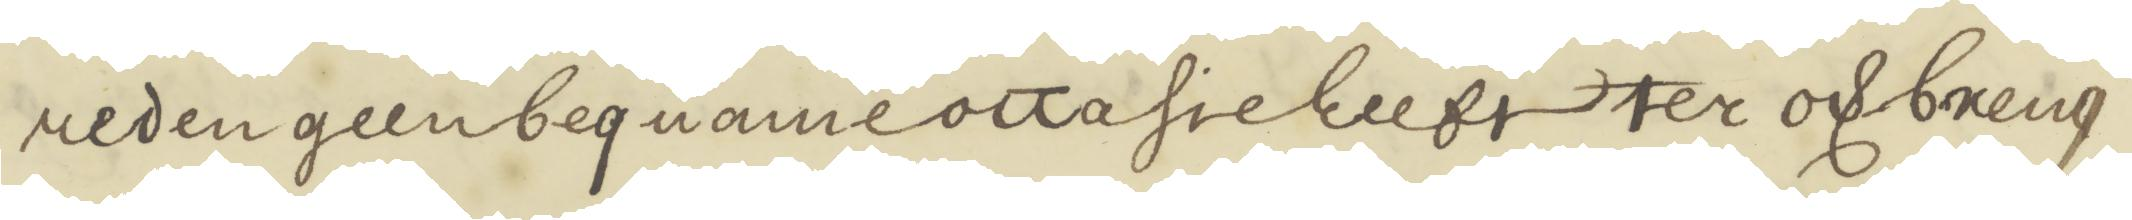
reden geen bequame occasie heeft ter overbreng
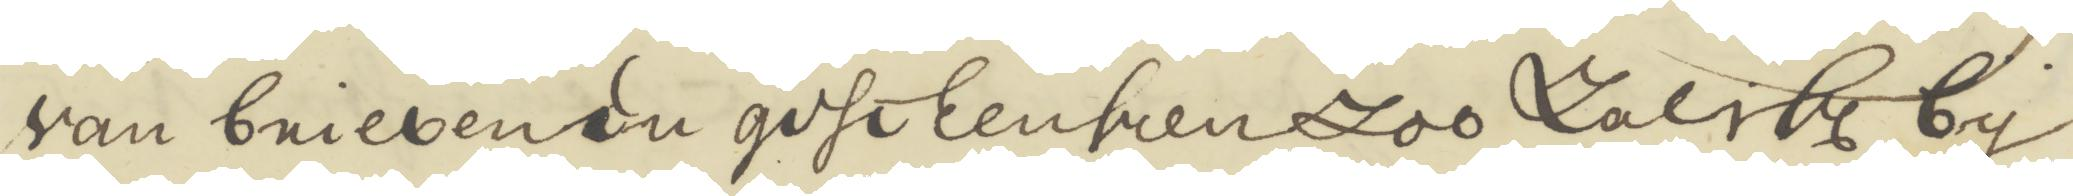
van brieven en geschenken zoo zal ik bij
